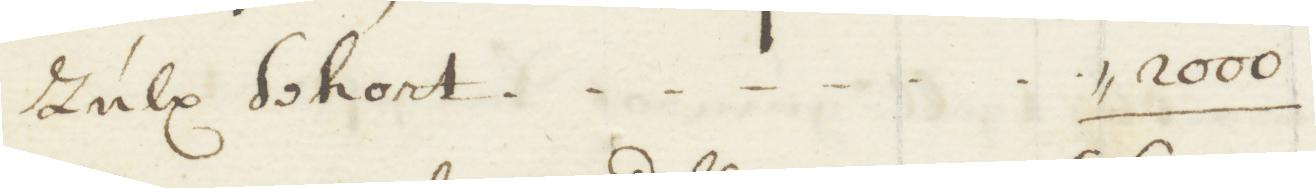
zulx te kort - - - - - - - „ 2000
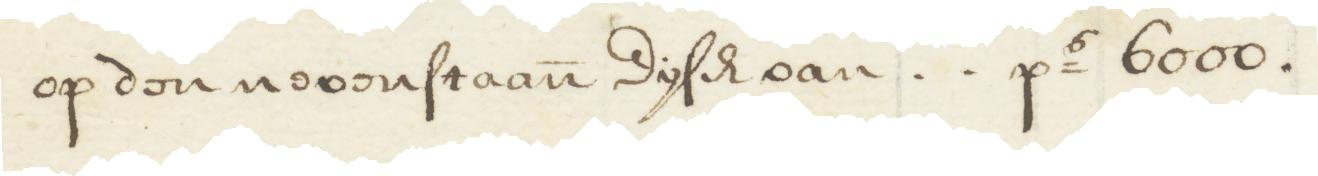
op den nevenstaan Eijsch van - - p=s 6000.
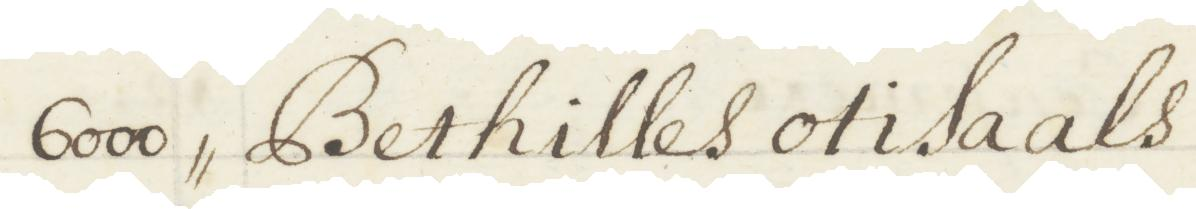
6000 „ Bethilles otisaals
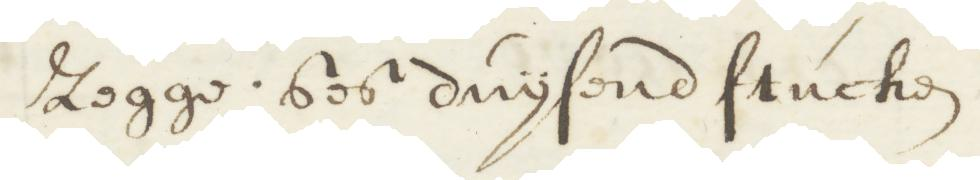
Zegge sos duijsend stucken
